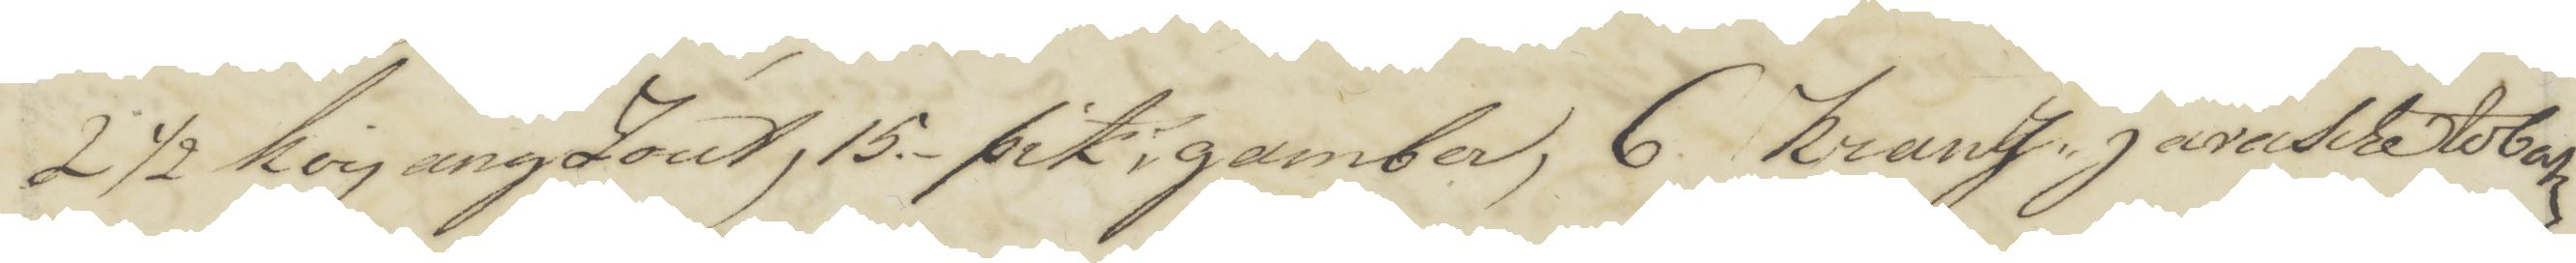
2½ koijang Zout, 15.– pik„s gamber, 6. kranj„s javasche tobak
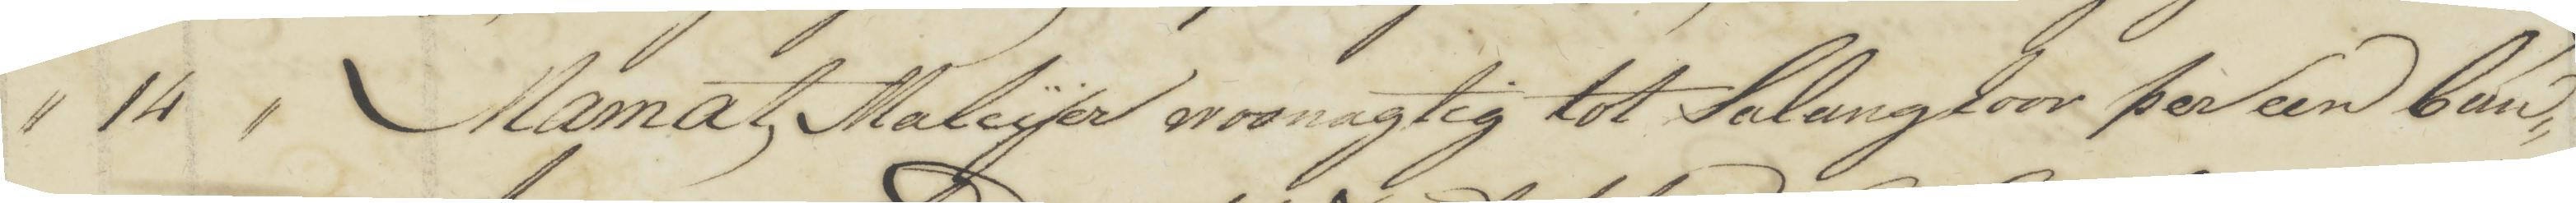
„ 14 „ Mamat, Maleijer woonagtig tot Salanghoor per een bau„
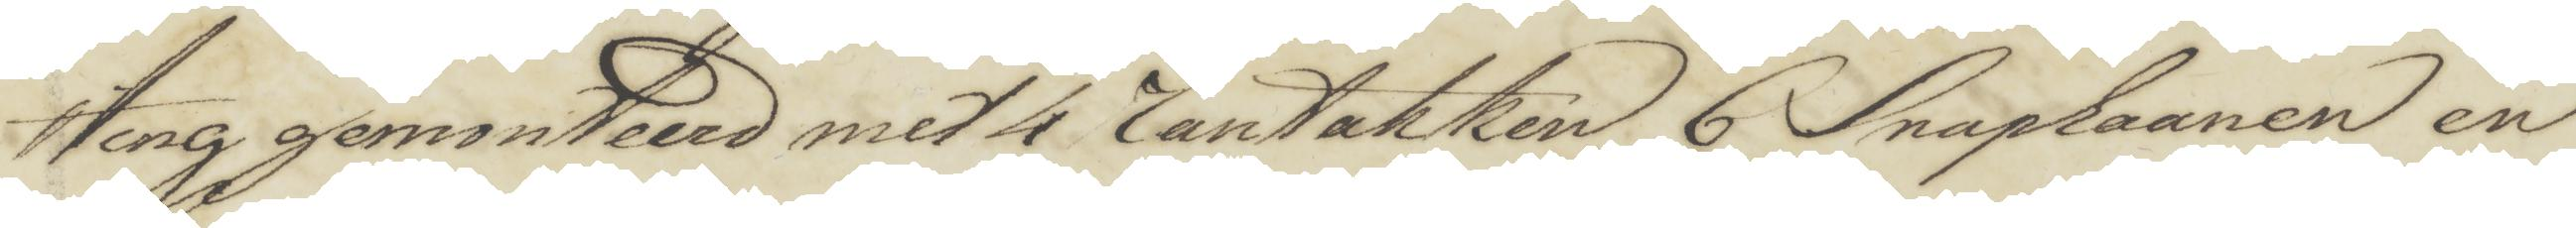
„ting gemonteerd met 4 rantakken 6 snaphaanen en
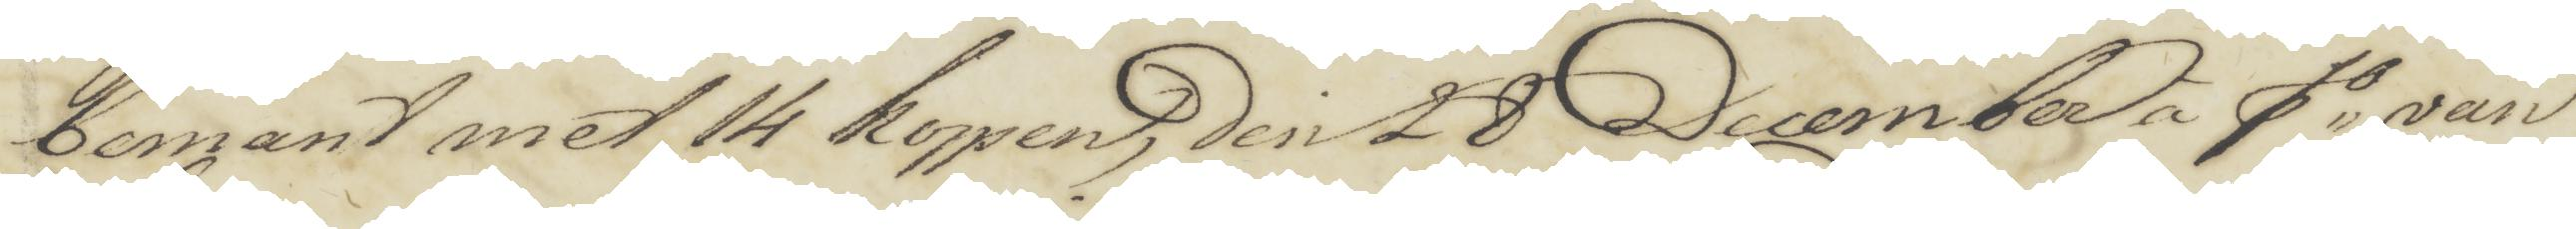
bemant met 14 koppen, den 28 December à p„s van
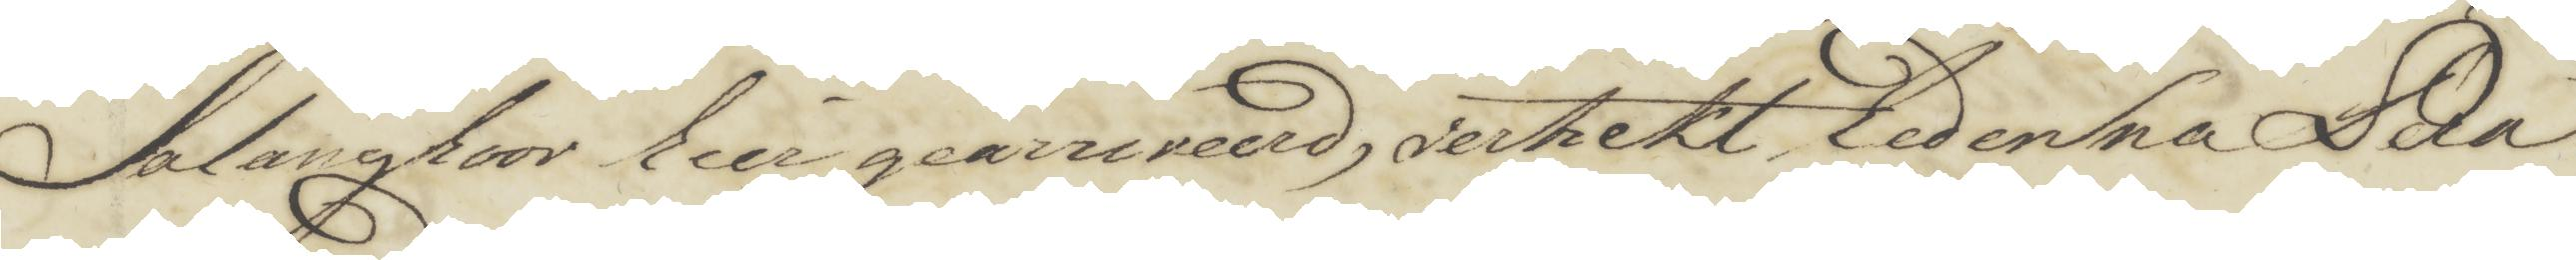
Salanghoor hier gearriveerd, vertrekt, heden na Pera
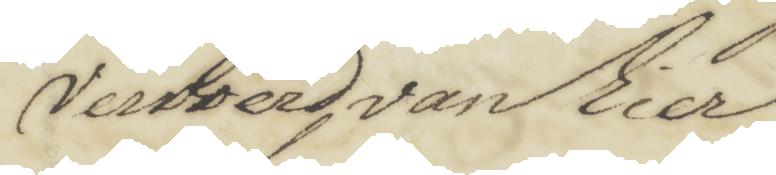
vervoerd, van hier
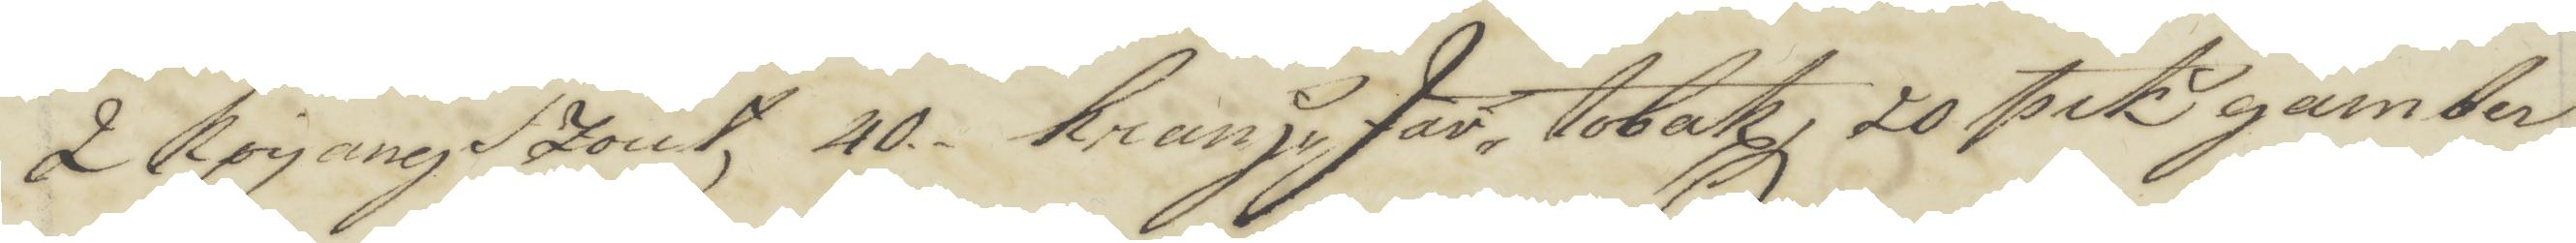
2 koijangs Zout, 40.- kranj„s Jav„s tobak, 20 piks gamber
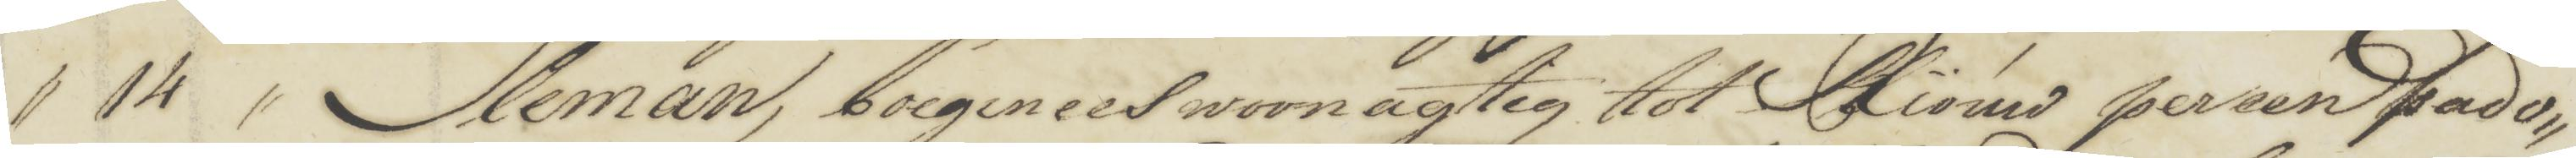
„ 14 „ Sleman, boeginees woonagtig tot Riouw per een pado„
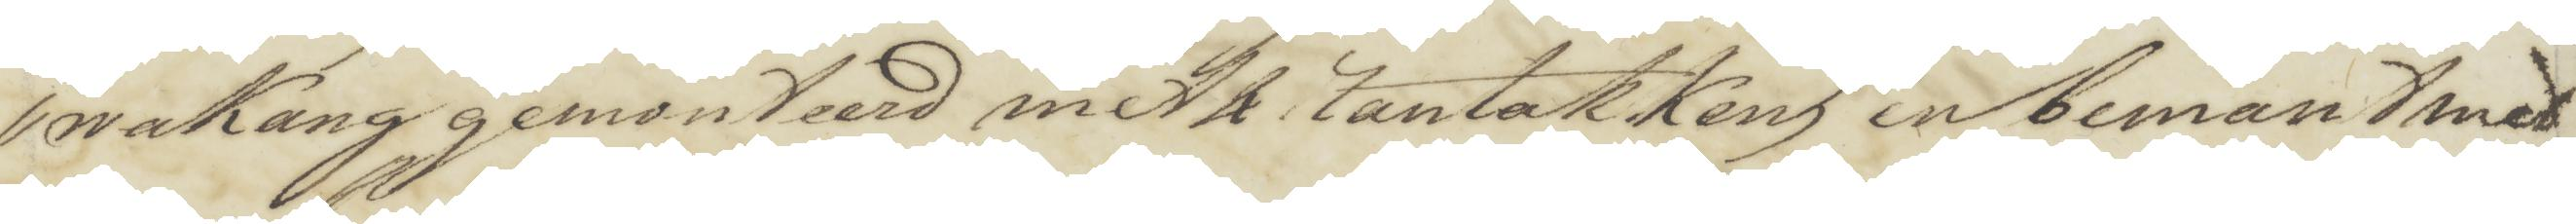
wakang gemonteerd met 4: rantakken, en bemant met
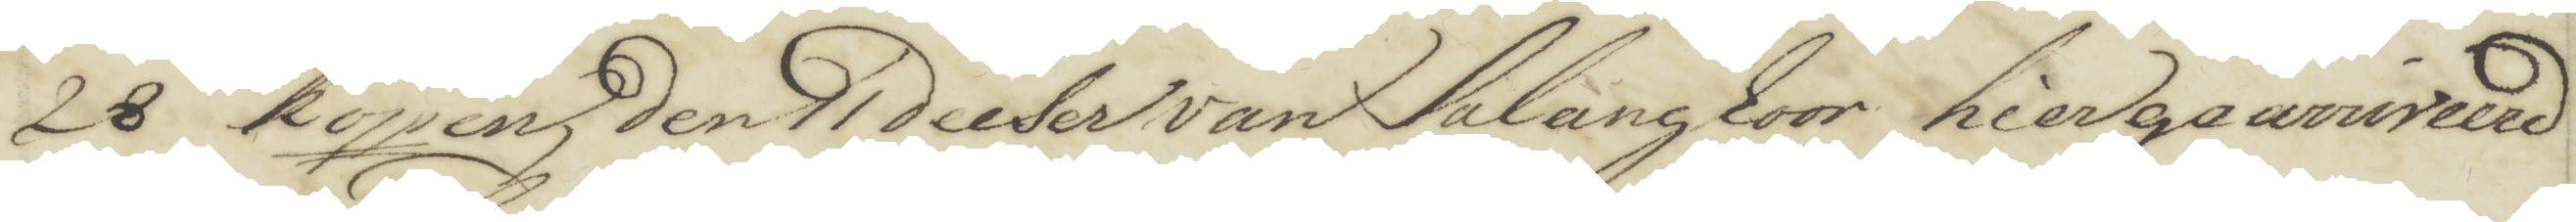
28 koppen, den 11 deeser van salanghoor hier gearriveerd
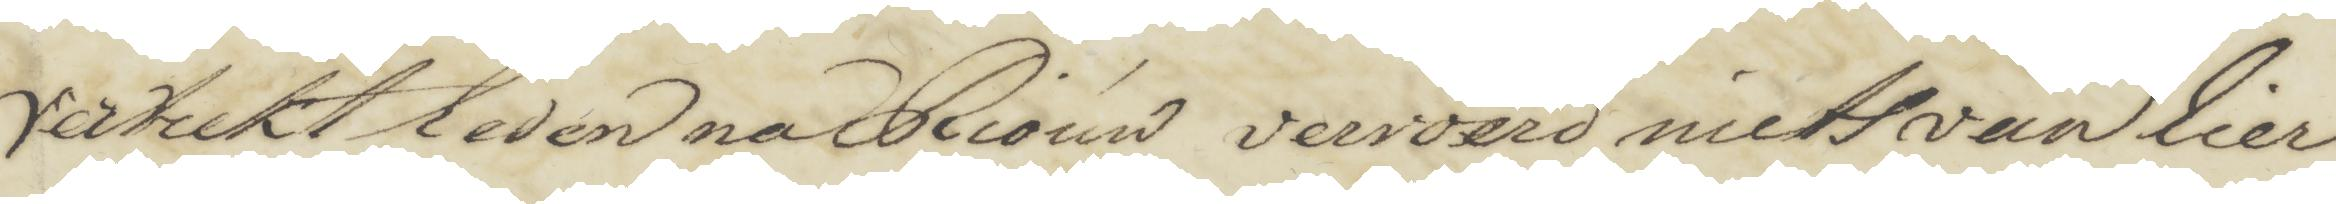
vertrekt heden na Riouw vervoerd niets van hier
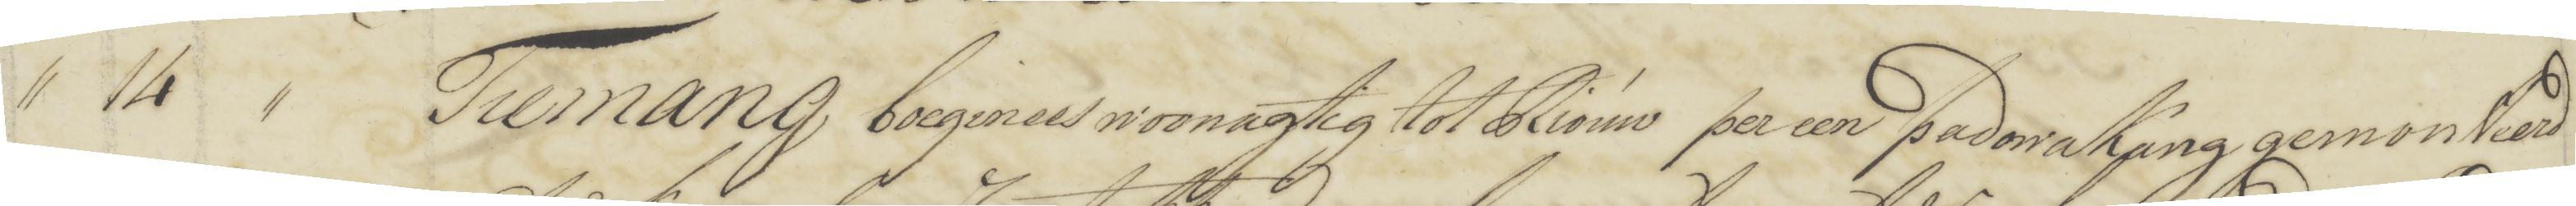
„ 14 „ Tiemang, boeginees woonagtig tot Riouw per een padowakang gemonteerd
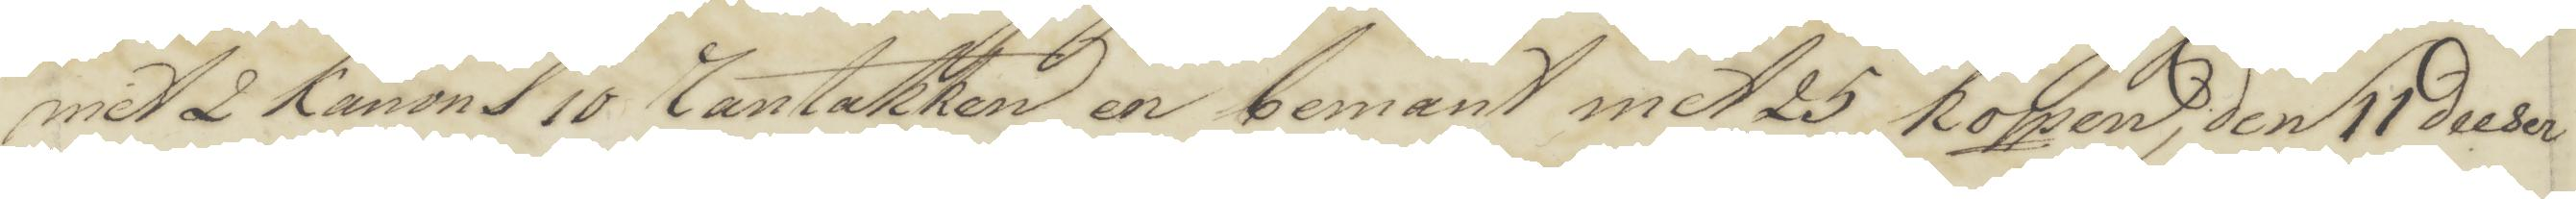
met 2 kanons 10 rantakken en bemant met 25 koppen, den 11 deeser
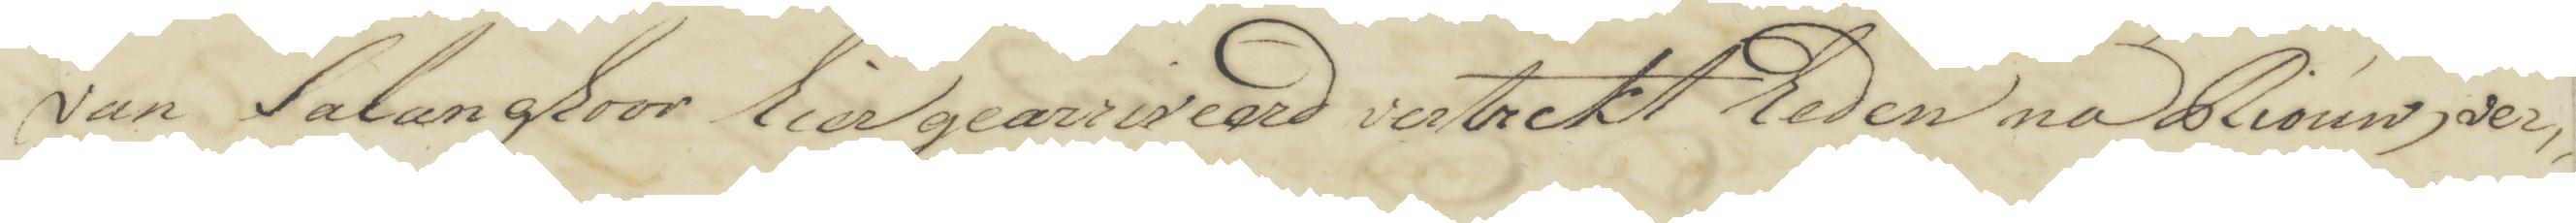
van salanghoor hier gearriveerd vertrekt heden na Riouw, ver„
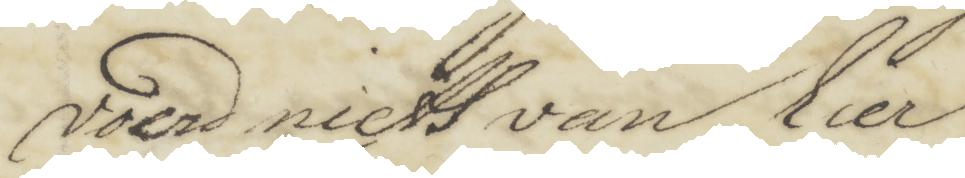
voerd niets van hier
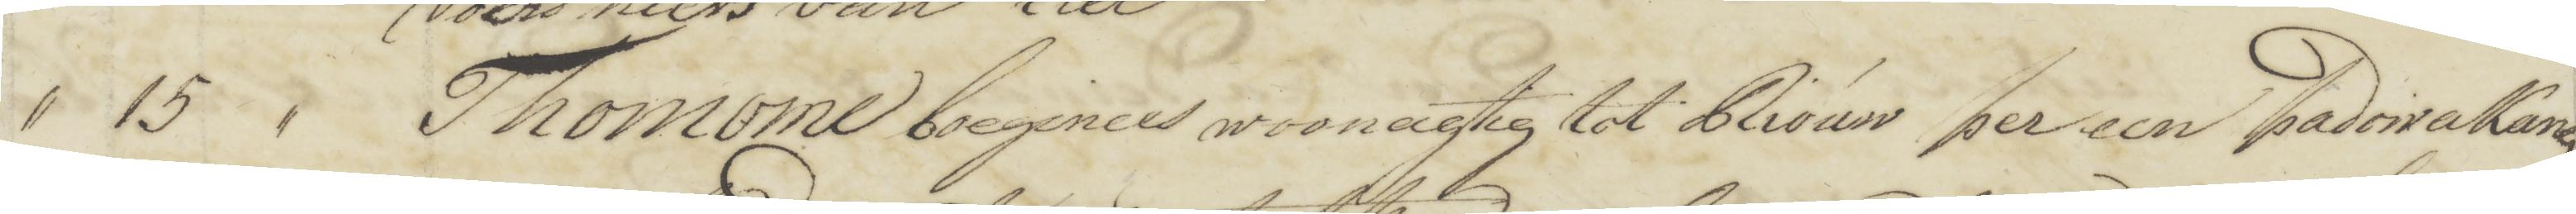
„ 15 „ Thomome boeginees woonagtig tot Riouw per een padowakang
